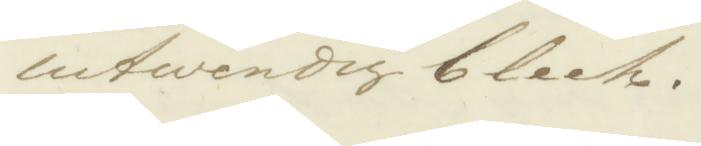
uitwendig bleek.
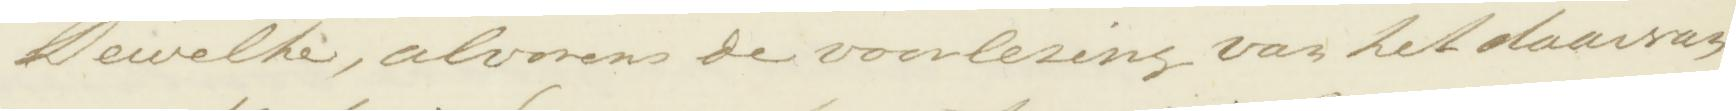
Dewelke, alvorens de voorlezing van het daarvan
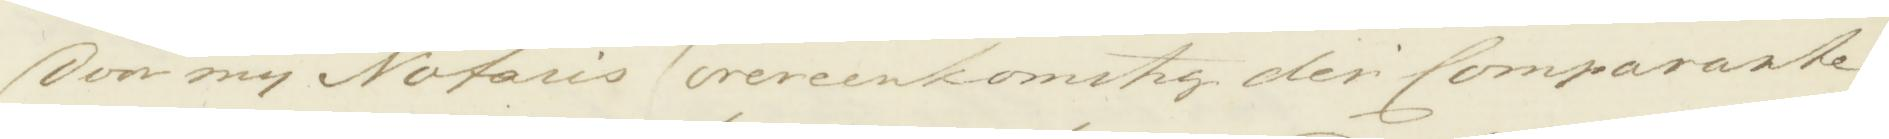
door my Notaris (overeenkomstig der Comparante
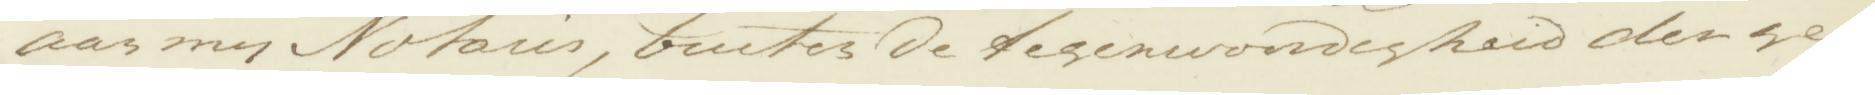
aan my Notaris, buiten de tegenwoordigheid der ge
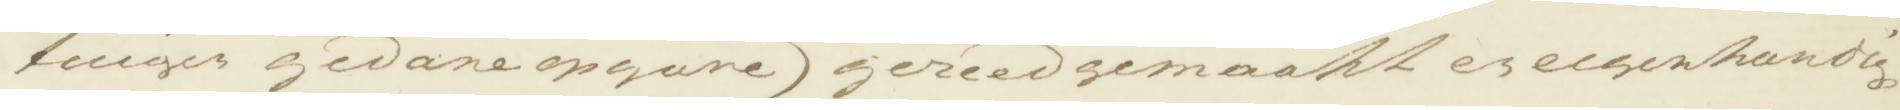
tuigen gedane opgave) gereedgemaakt en eigenhandig
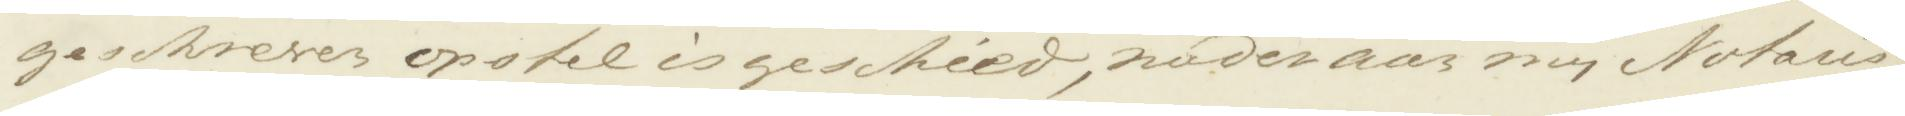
geschreven opstel is geschied, nader aan my Notaris,
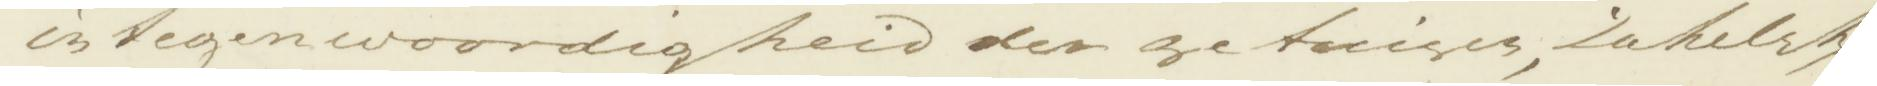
in tegenwoordigheid der getuigen, zakelyk
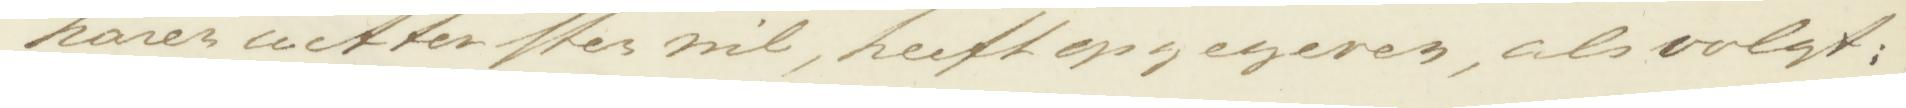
haren uittersten wil, heeft opgegeven, als volgt:
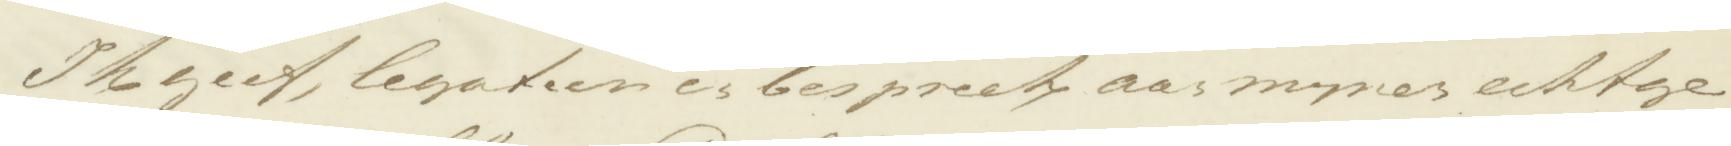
Ik geef, legateer en bespreek aan mynen echtge
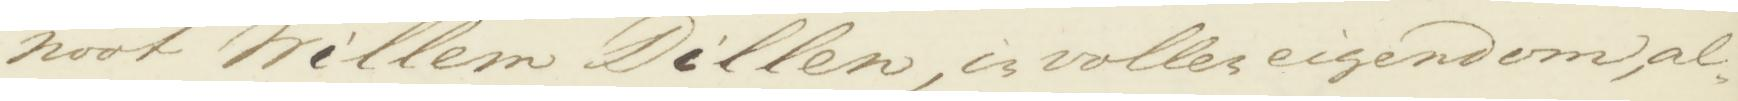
noot Willem Dillen, in vollen eigendom, al„
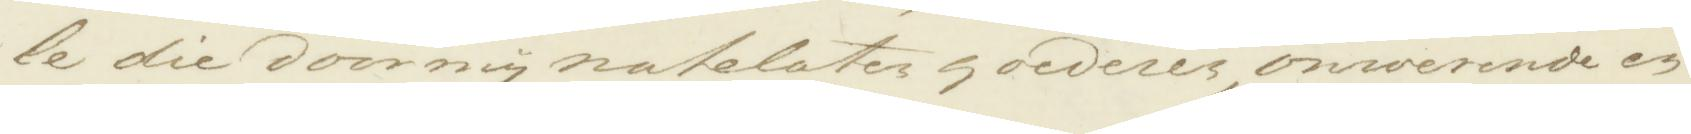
le die door mij natelaten goederen, onroerende en
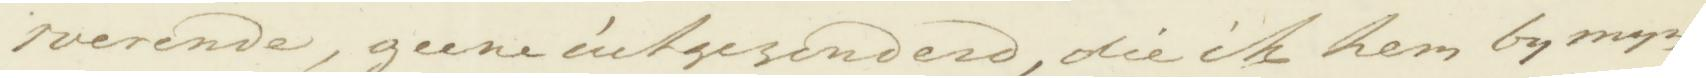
roerende, geene uitgezonderd, die ik hem by myn
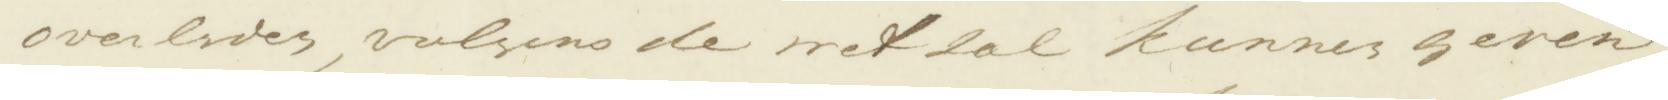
overlyden, volgens de wet zal kunnen geven
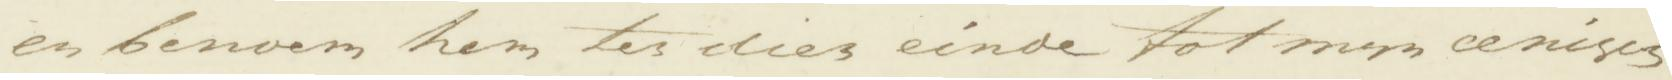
en benoem hem ten dien einde tot myn eenigen
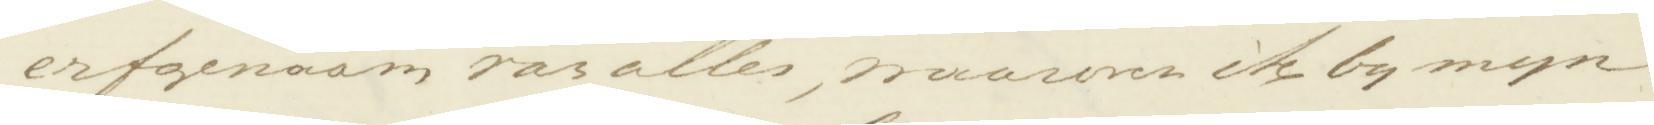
erfgenaam van alles, waarover ik by myn
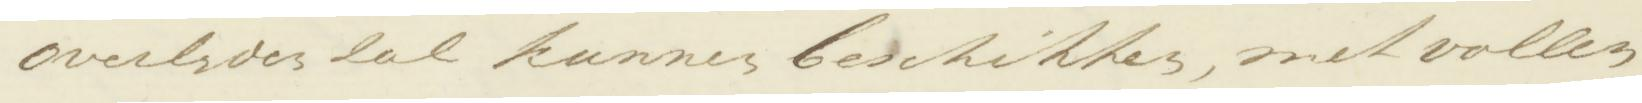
overlyden zal kunnen beschikken, met vollen
